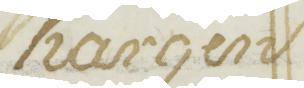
Chargen
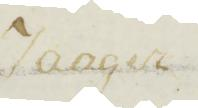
Jaager
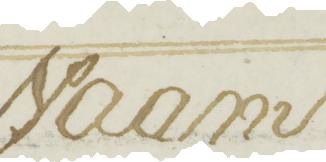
Naam
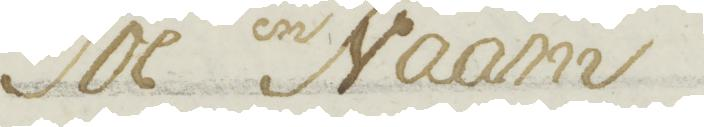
Toe Naam
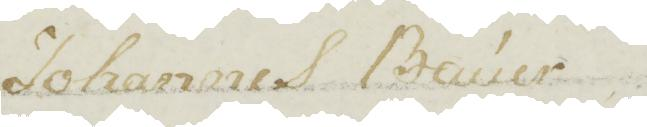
Johannes Bauer
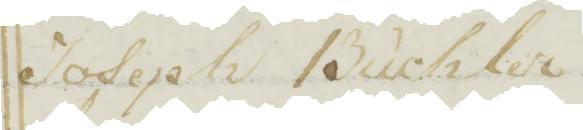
Joseph Buchler
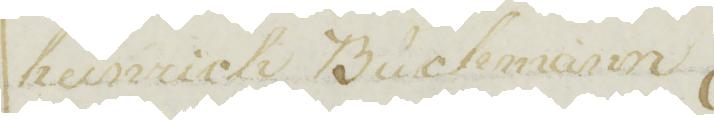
heinrich Buchmann
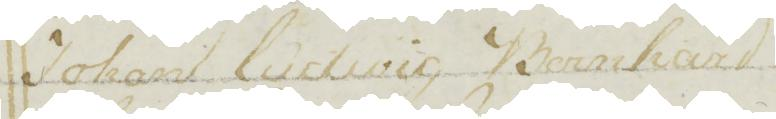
Johan ludwig Bernhard
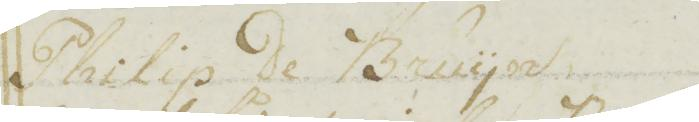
Philip de Bruijn
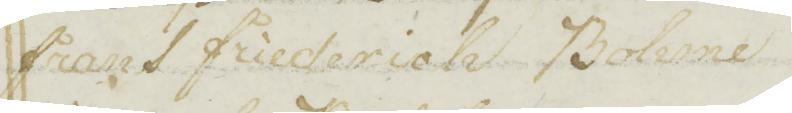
frans friederich Bohme
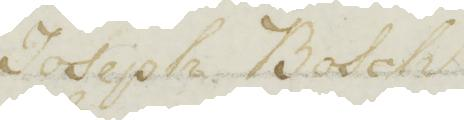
Joseph Bosch
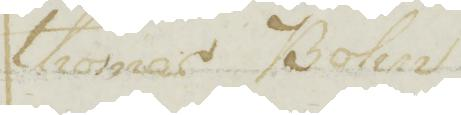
thomas Bohn
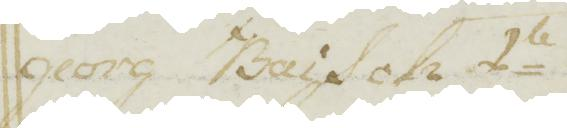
georg Baisch 2=te
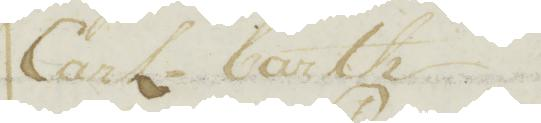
Carl barth
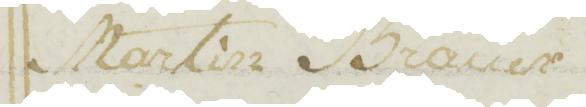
Martin Brauer
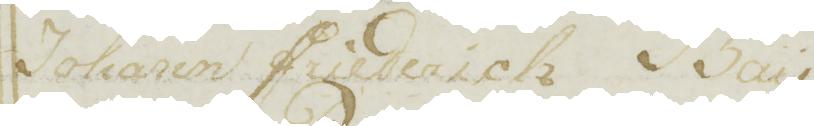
Johann friederich Baij
